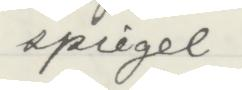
spiegel
